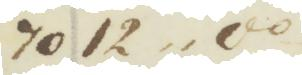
70. 12 „ d:o
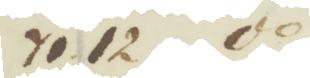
71 12 „ d:o
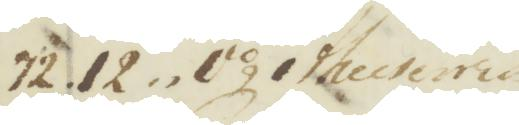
72.12„ d:o 1 theeservies
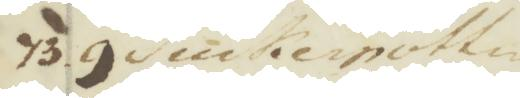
73 9 Suikerpotten
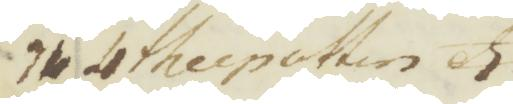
74 4 theepotten et
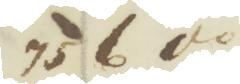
75 6 d:o
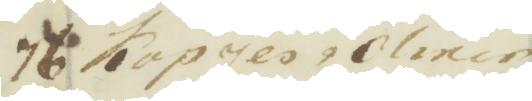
76 kopjes, diner
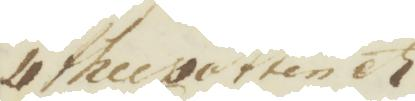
4 Theepotten et
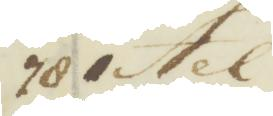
78 1 Stel
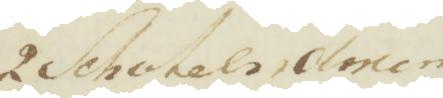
2 Schotels, diner
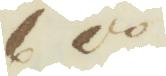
6 d:o
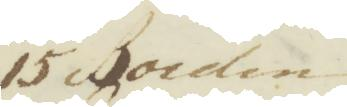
15 Borden
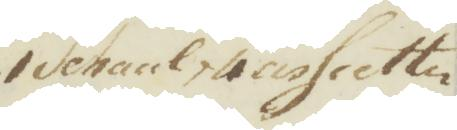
1 Schaal,4 assietten
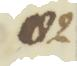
82.
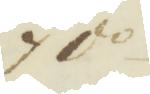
7 d:o
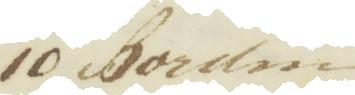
10 Borden
